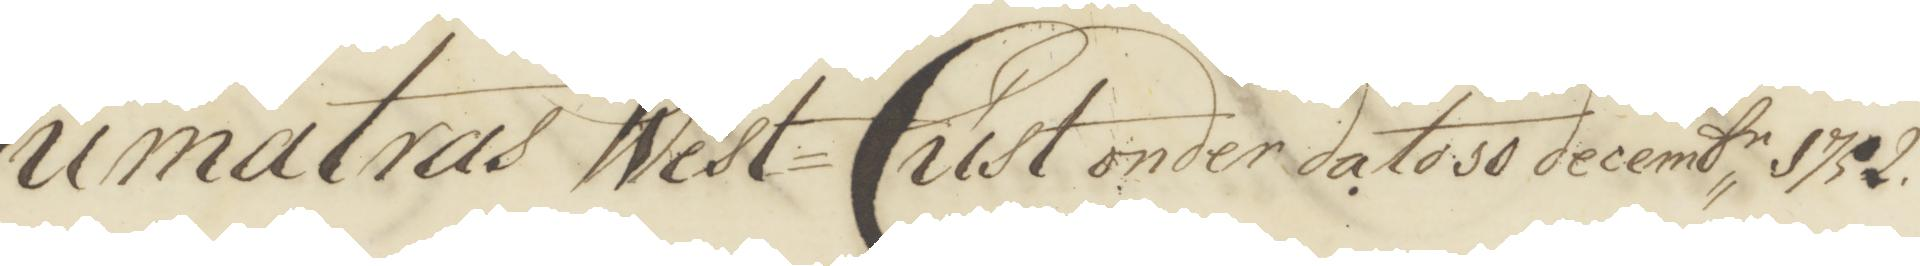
Van Sumatras West=Cust onder dato 10 Decemb„r 1752
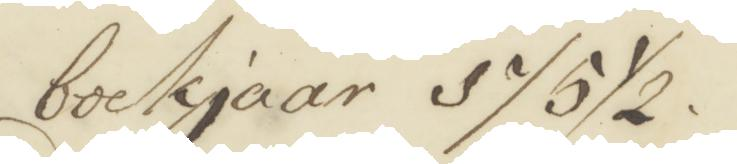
boekjaar 5/5½.
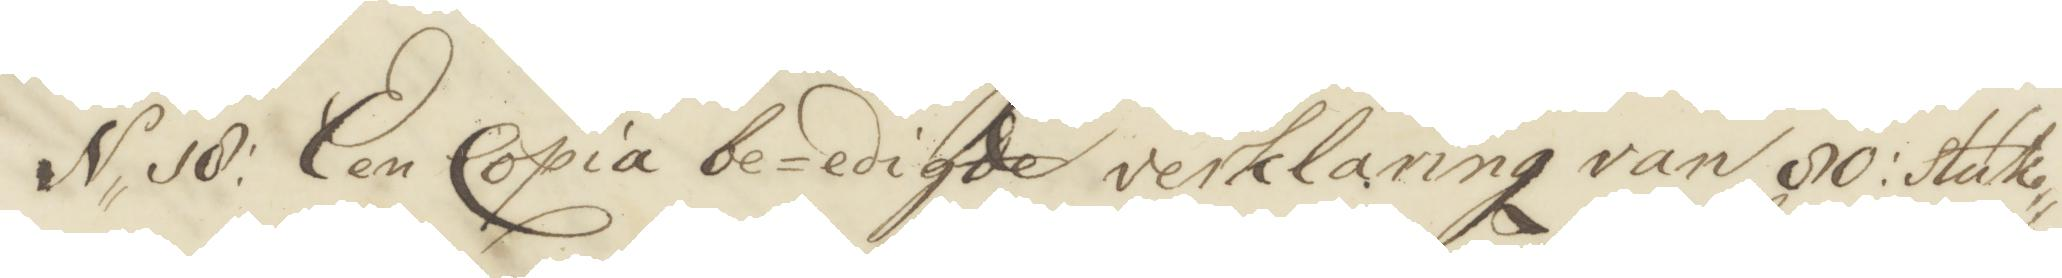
N„18: Een Copia be=edigde verklaring van 80: stuk„
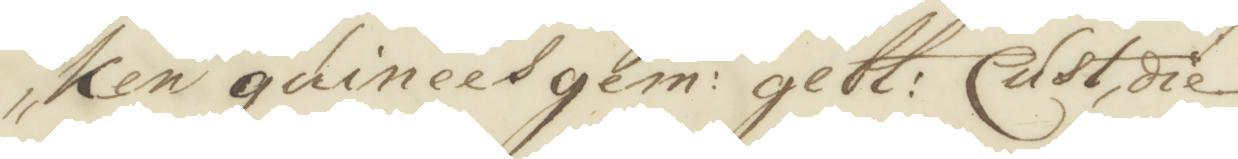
„ken guinees gem: gebl: Cust, die
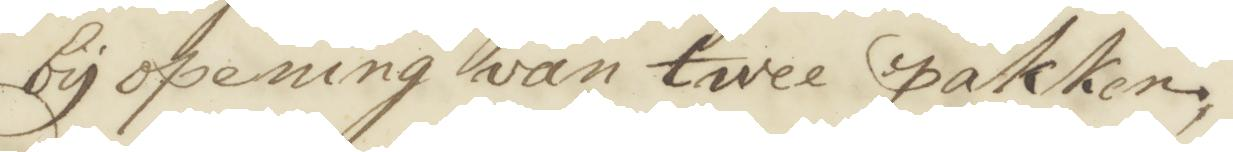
bij opening van twee pakken,
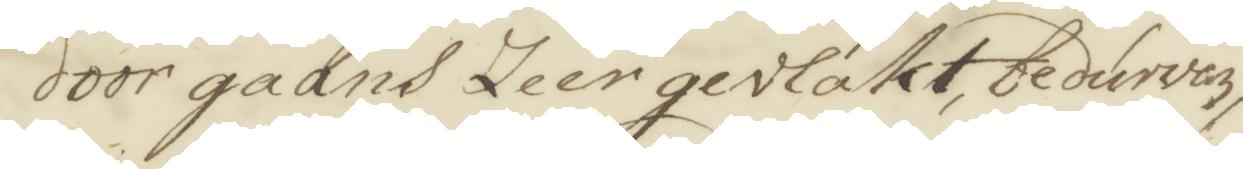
door gaans zeer gevlakt, bedurven,
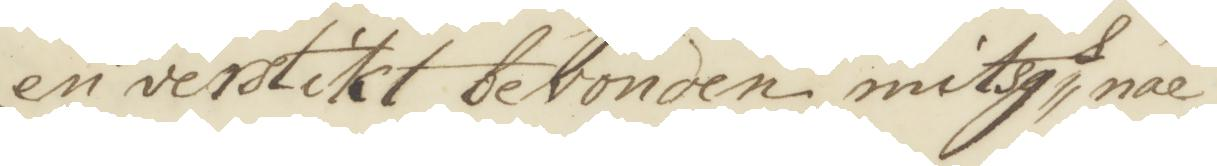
en verstikt bevonden mitsg„s nae
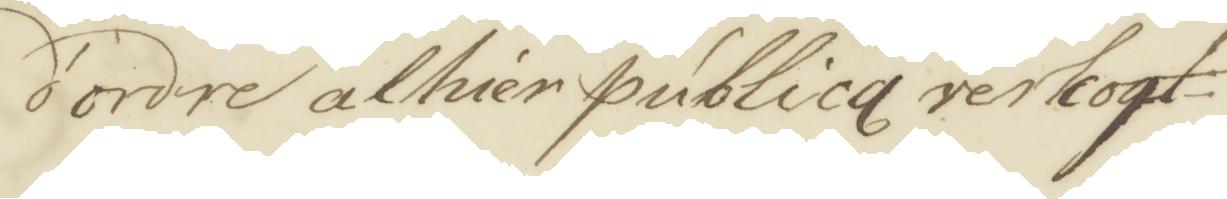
d'ordre alhier publicq verkogt
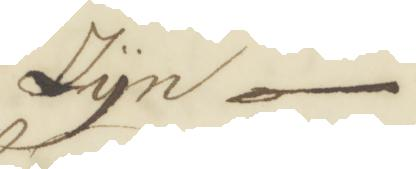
zijn — .
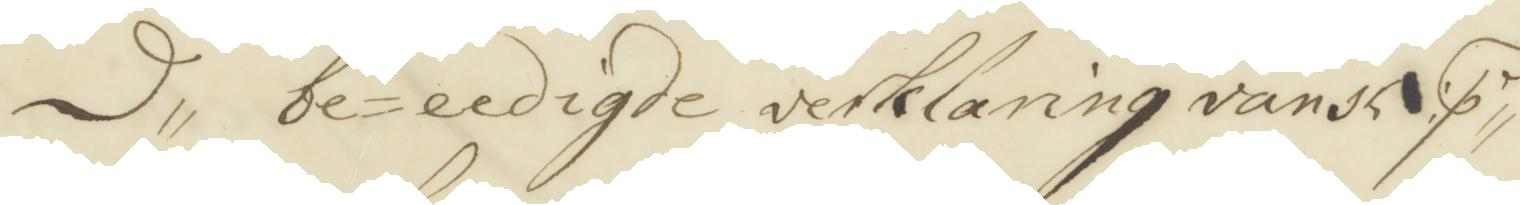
19: „ d„ be=eedigde verklaring van 15: p„s
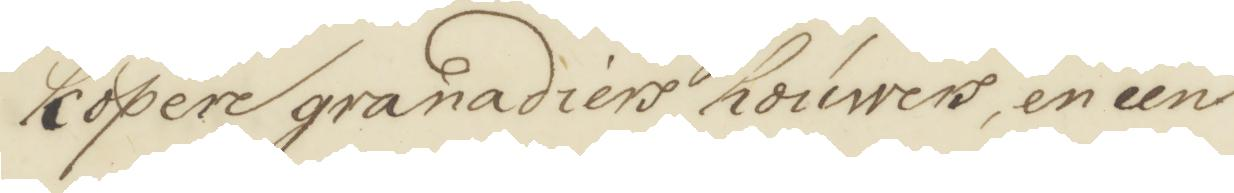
kopere granadiers houwers, en een
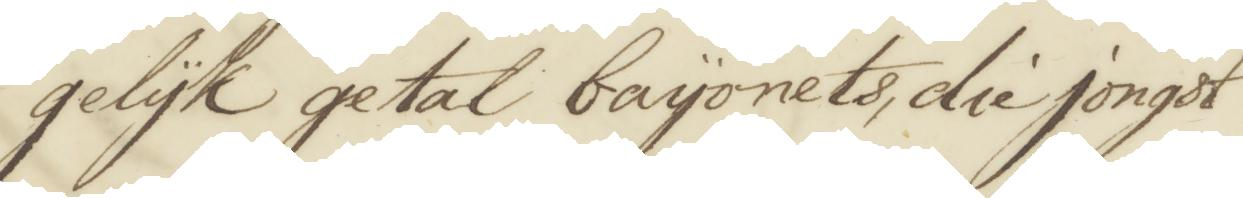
gelijk getal baijonets, die jongst
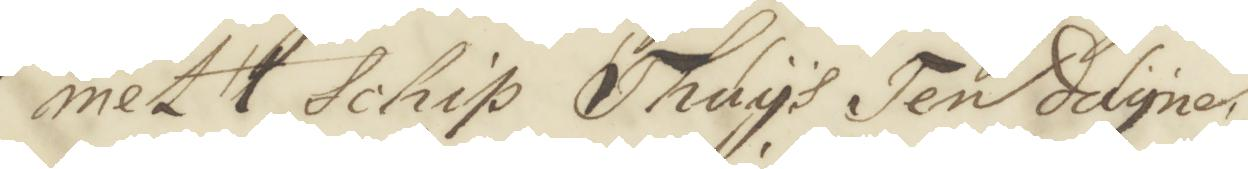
met ’t schip Thuijs Ten duijne,
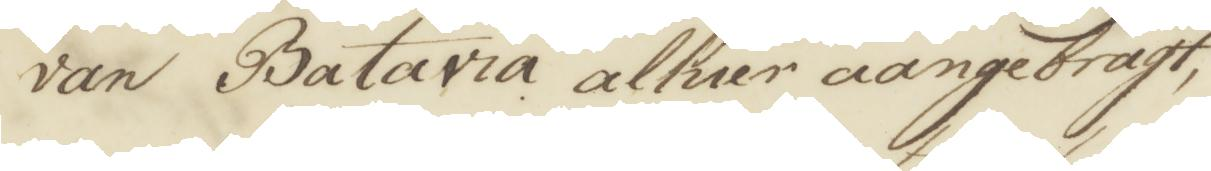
van Batavia alhier aangebragt,
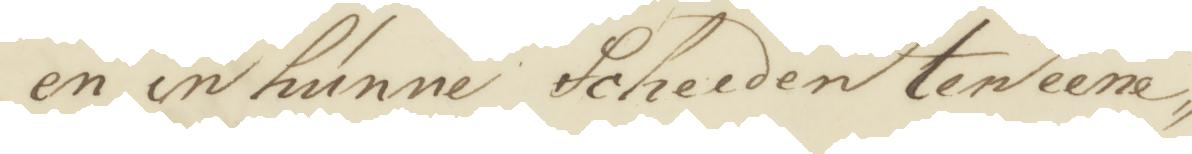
en in hunne scheeden ten eene„
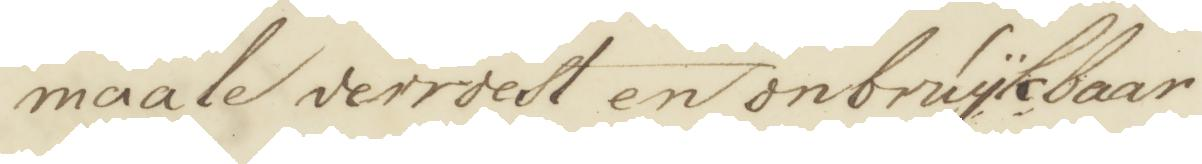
maale verroest en onbruijkbaar
